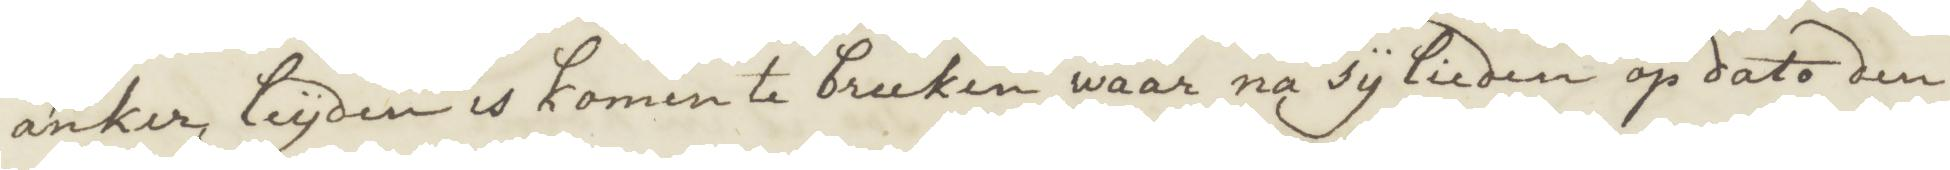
anker leijden is komen te breeken waar na sij lieden op dato den
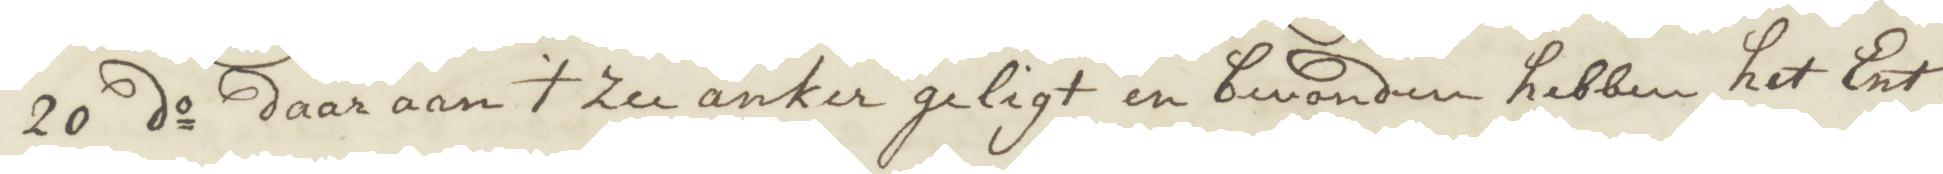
20 d=o daar aan ’t zee anker geligt en bevonden hebben het Ent
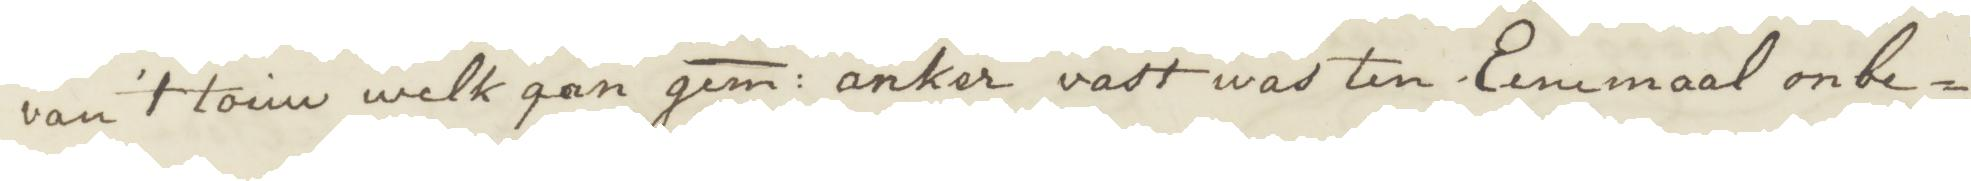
van ’t touw welk aan gem: anker vast was ten Eemmaal onbe=
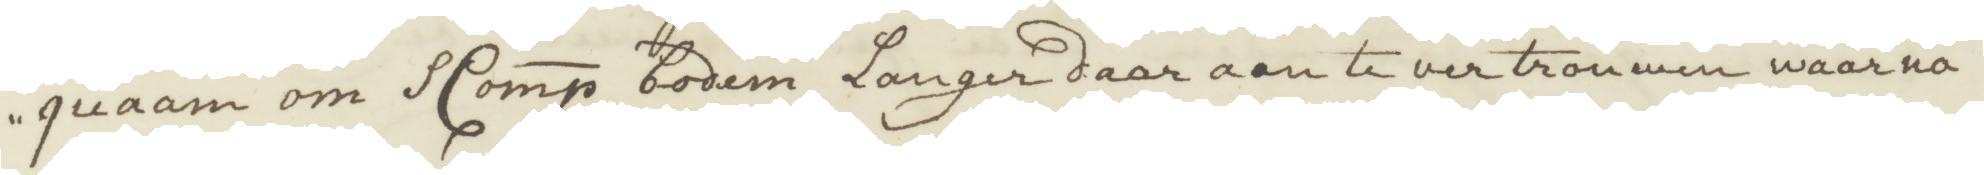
„quaam om sComp bodem Langer daar aan te vertrouwen waar na
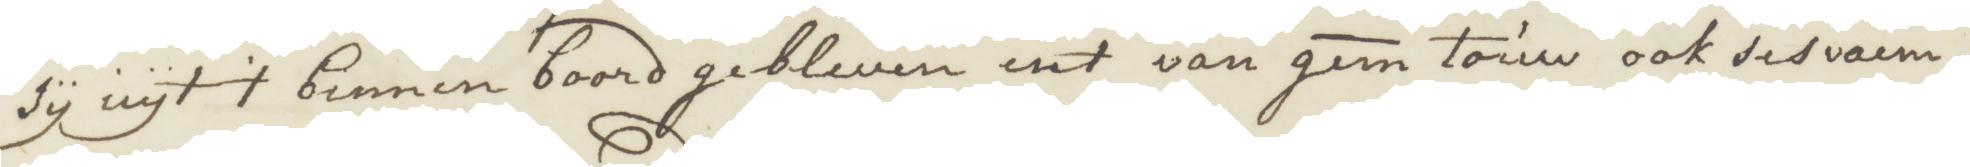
sij uijt ’t binnen boord gebleven ent van gem touw ook ses vaem
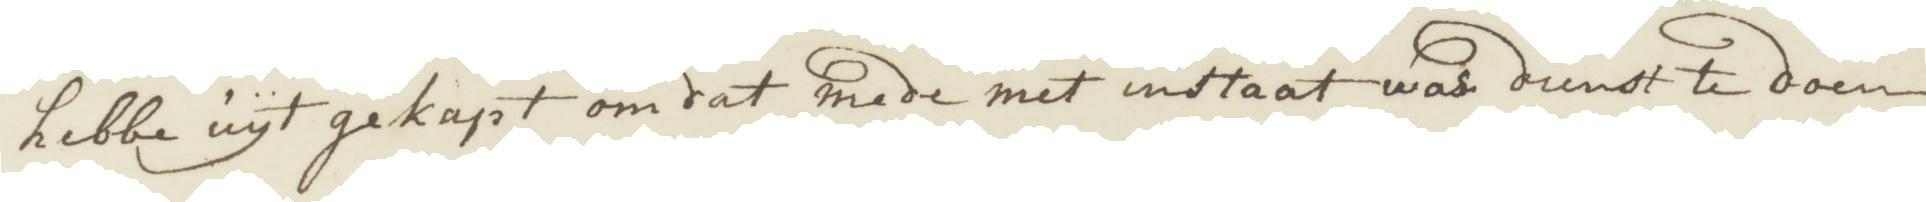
hebbe uijt gekapt om dat mede niet instaat was dienst te doen
